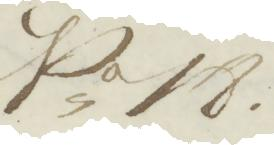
No 18.
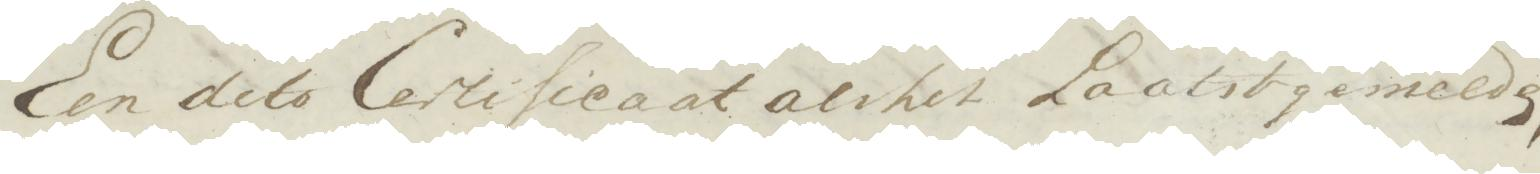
Een dito Certificaat als het Laatst gemelden,
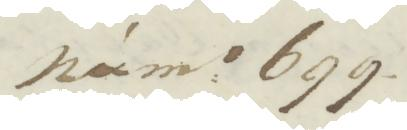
num:o 699.
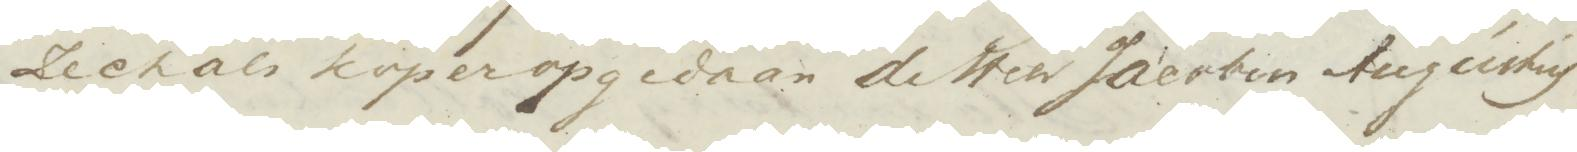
zich als koper opgedaan de Heer Jacobus Augustus
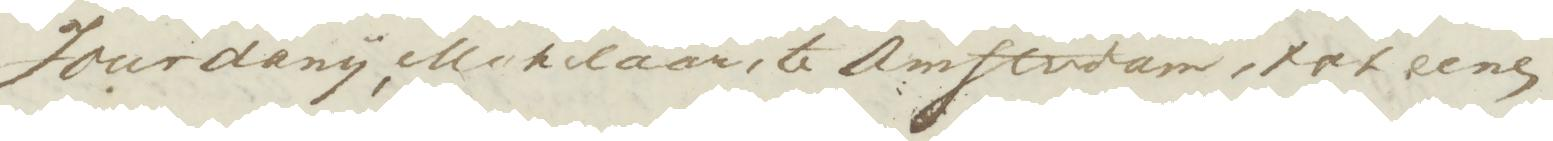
Jourdanij Makelaar, te Amsterdam, tot eenen
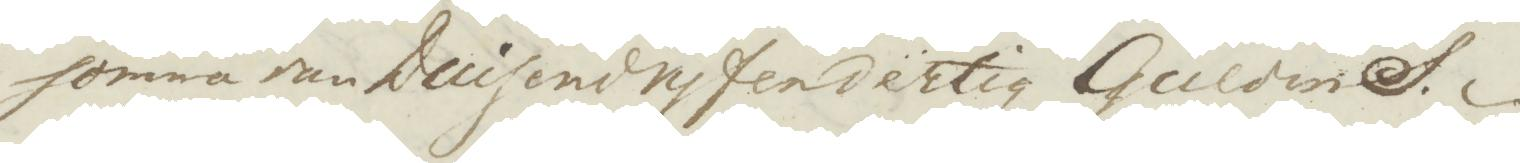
somma van Duisend vijfendertig Guldens.
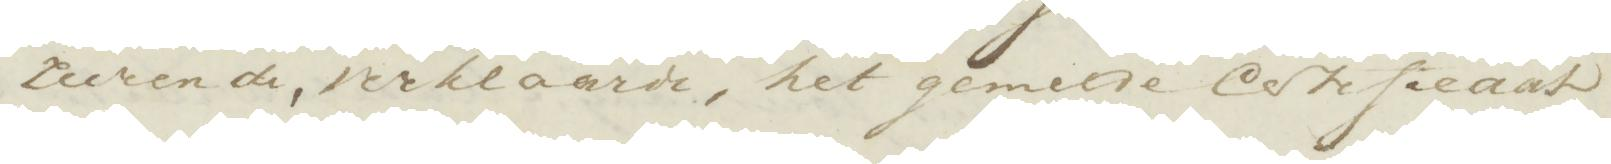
reerende, verklaarde, het gemelde certificaat
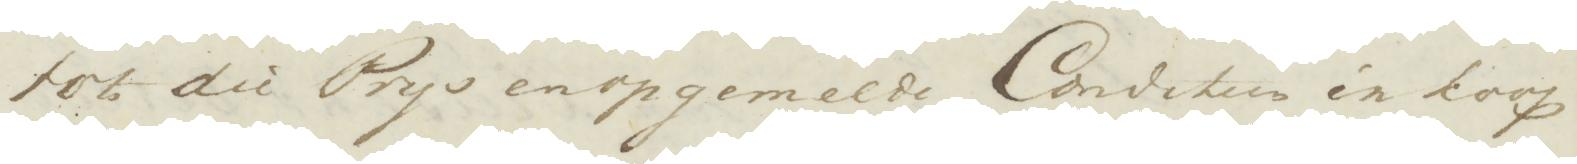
tot die Prijs en opgemelde Conditien in koop
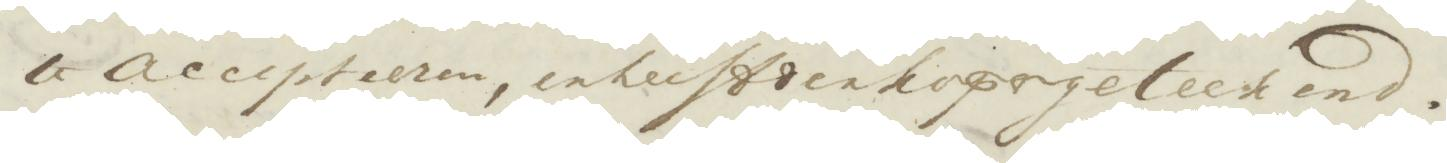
te accepteeren, en heeft der kope geteekend.
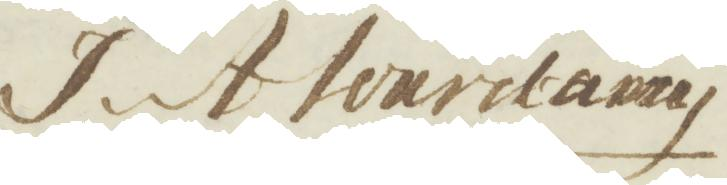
J.A Iourdany
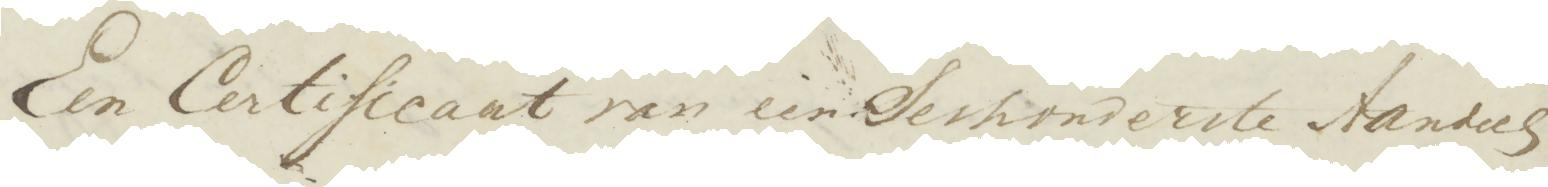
Een Certificaat van een Seshonderste Aandeel
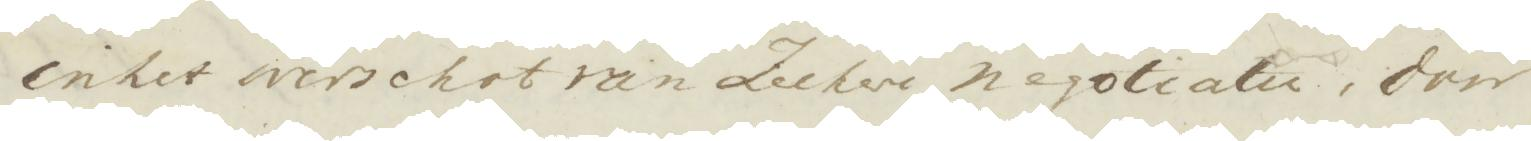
in het overschot van Zeekere Negotiatie, door
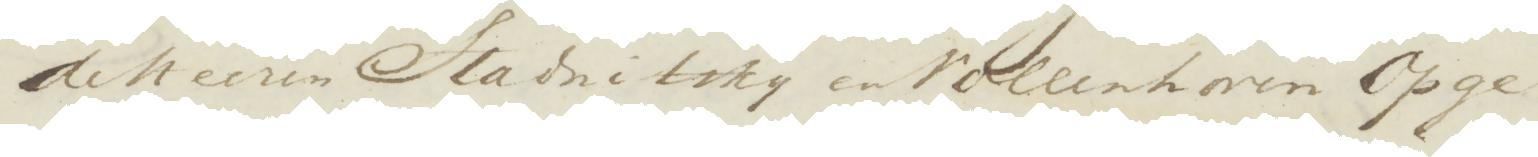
de Heeren Stadnitsky en Vollenhoven Opge
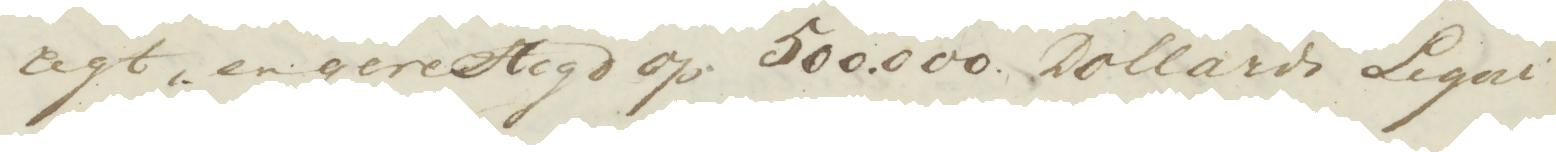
rigt, en gevestigd op 500.000. Dollards Lequi
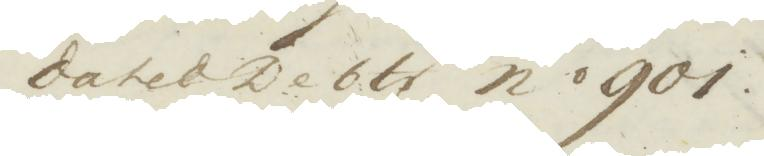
dated Debts N.o 901.
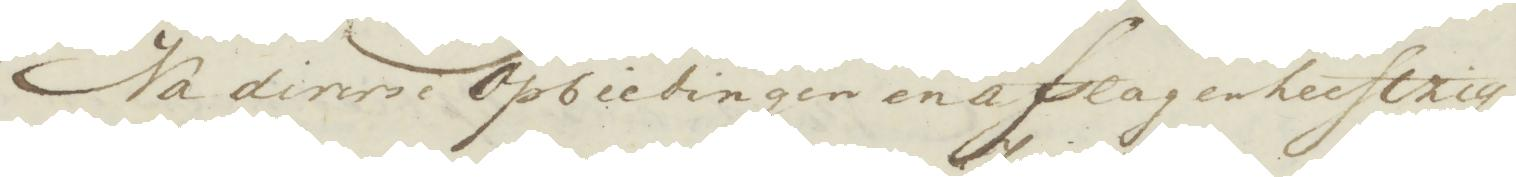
Na diverse Opbiedingen en afslagen heeft zig
